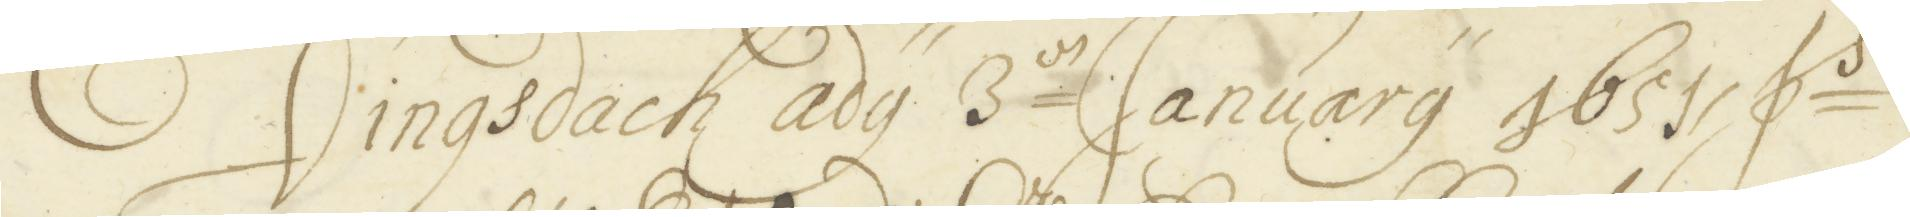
Dingsdach adij 3=en Januarij 1651, P=s
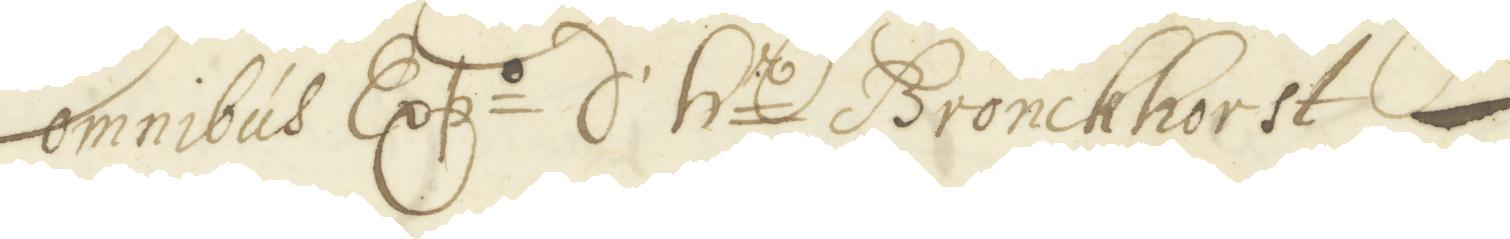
omnibus Exp=o d’ H=r Bronckhorst
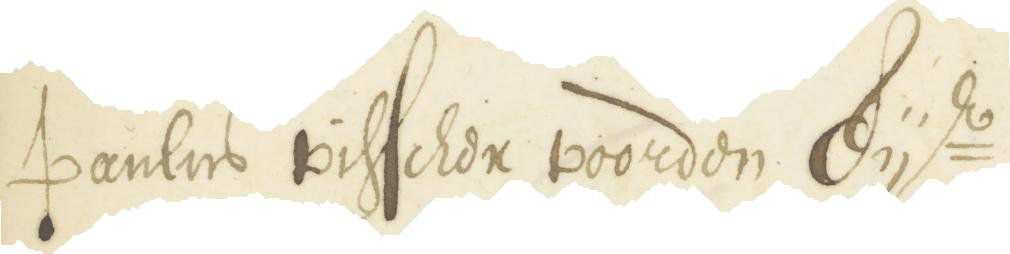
paulus visscher voorden Eij=r
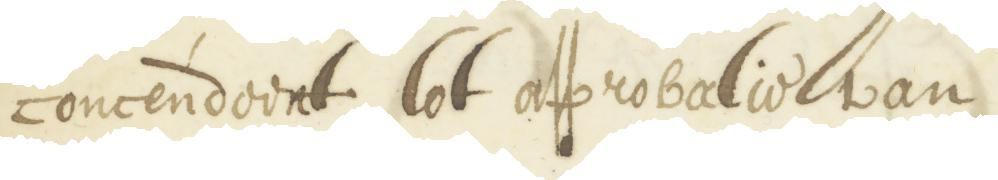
concludeert tot approbatie van
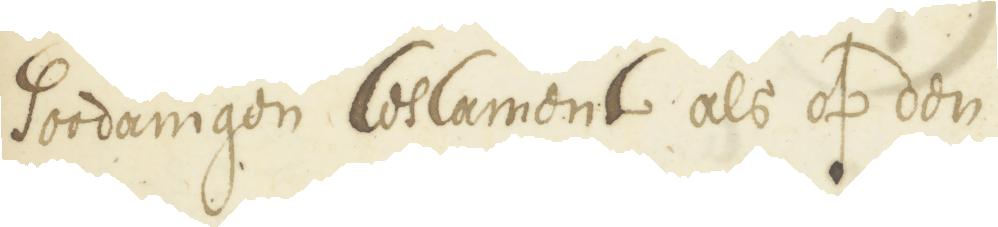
soodanigen Testament als op den
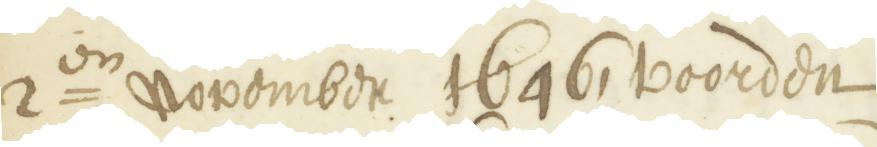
2=en november 1646, voorden
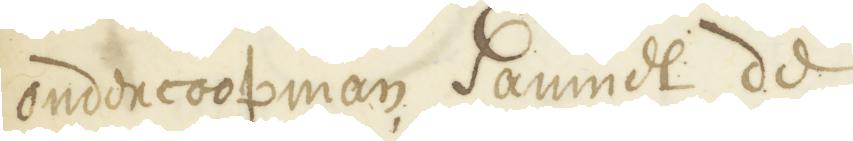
ondercoopman Samuel de
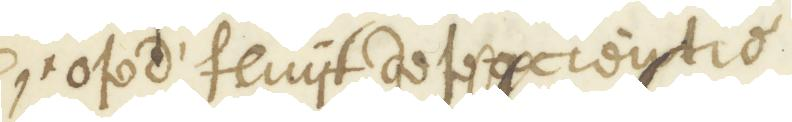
^ op d’ fluijt de pacientie
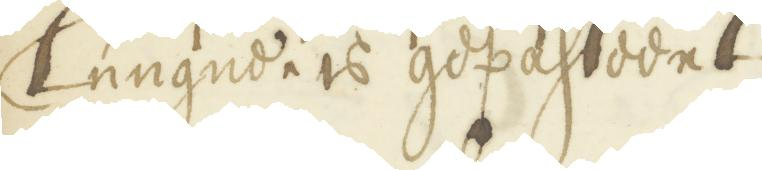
Lungne ^ is gepasseert
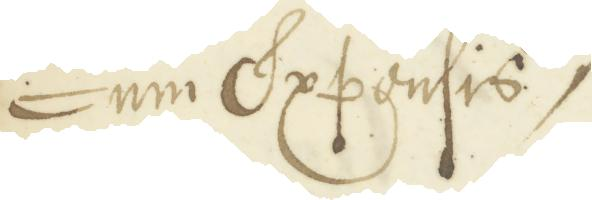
cum Expensis. /
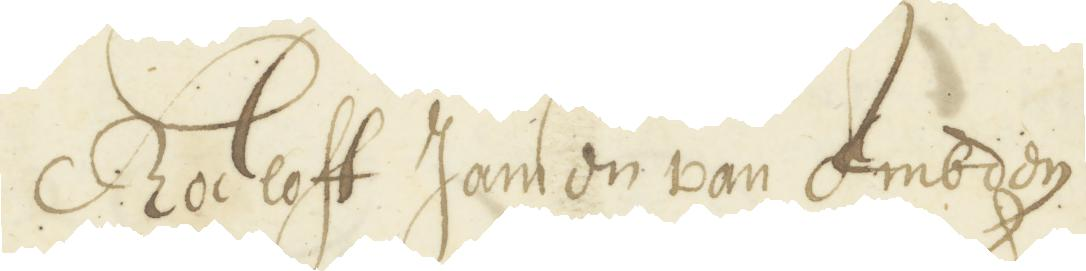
Roeloff Jansen van Embden
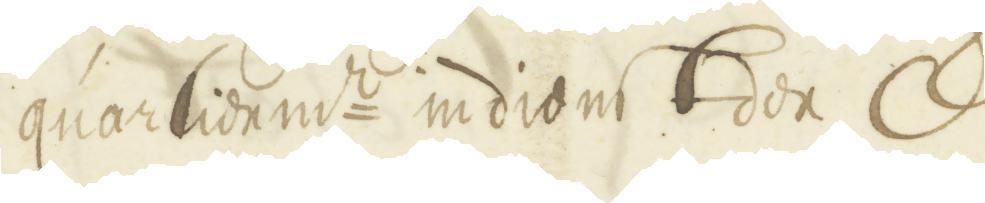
quartierm=r in dienst der E
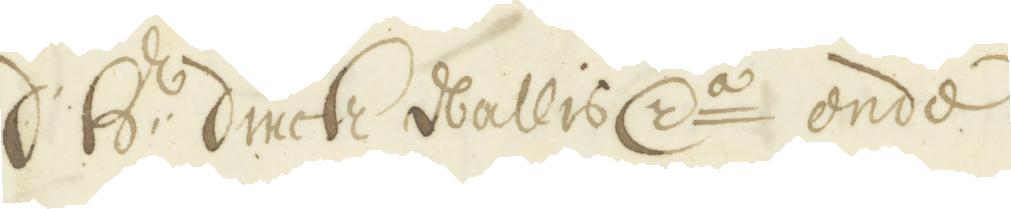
d’ h:r dirck wallis r=a onde
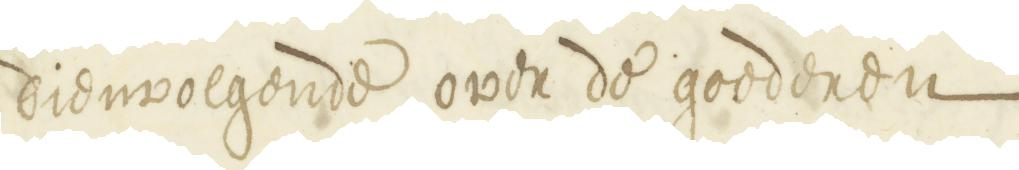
dienvolgende over de goederen
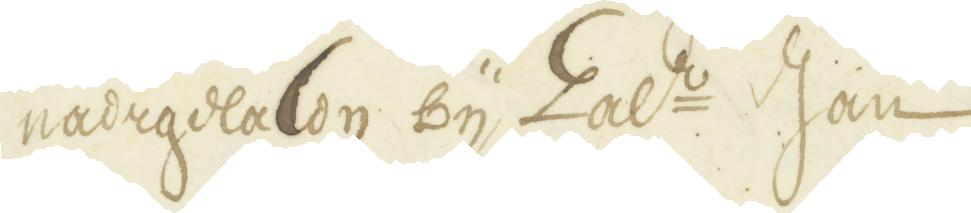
naergelaten bij Zal=r Jan
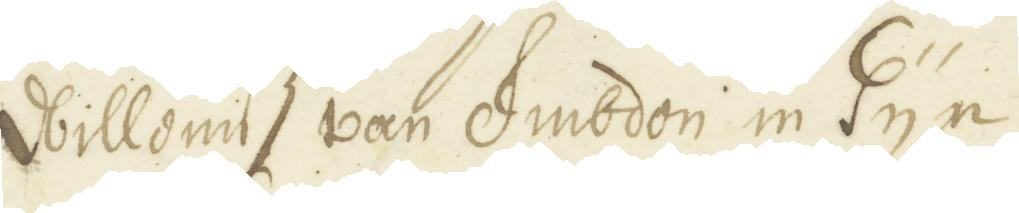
Willemz van Embden in sijn
